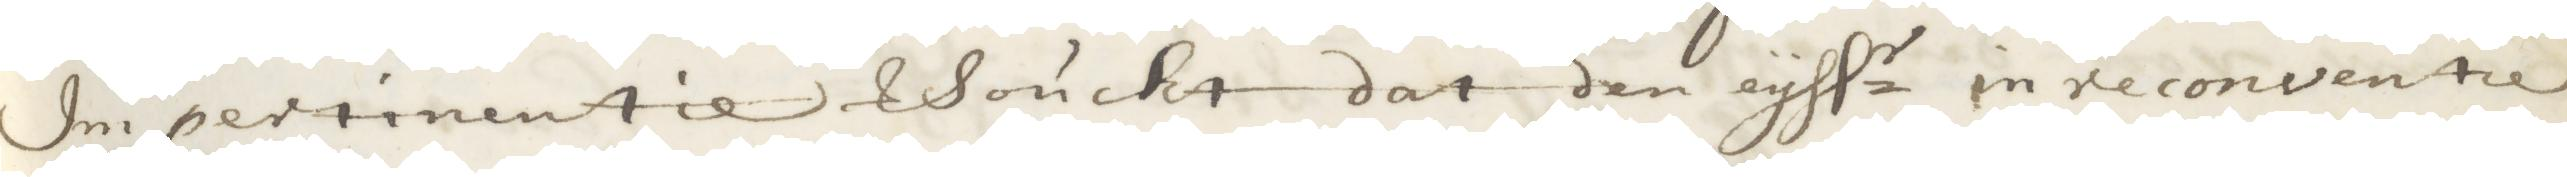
Im pertinentie versouckt dat den eijss=r in reconventie
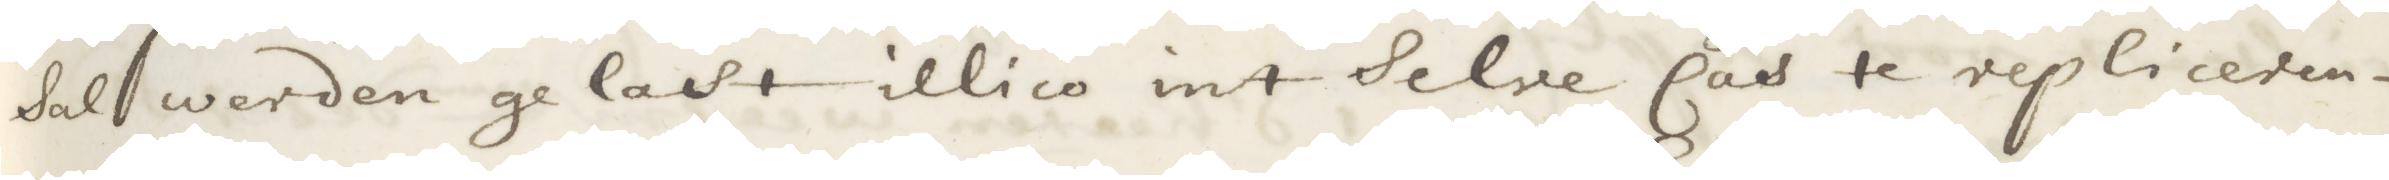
sal werden gelast illico in't selve Cas te repliceren
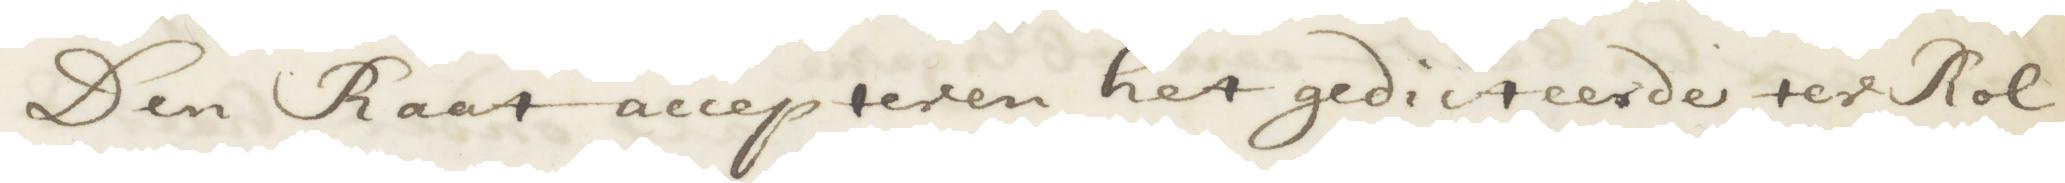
Den Raat accepteren het gedicteerde ter Rol
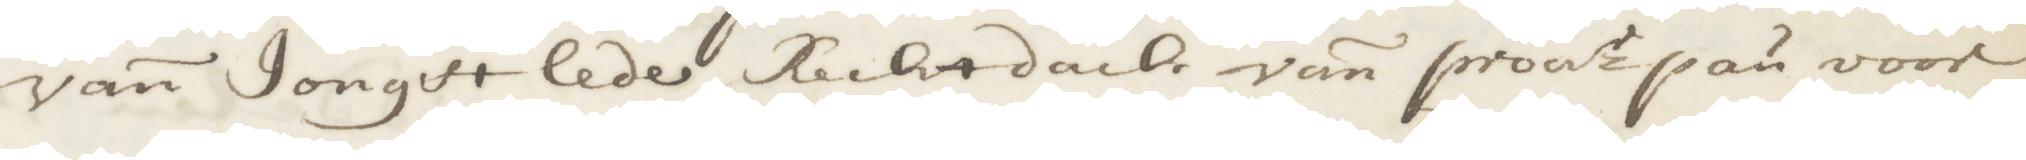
van Jongst lede Rechtdach van proc=r pau voor
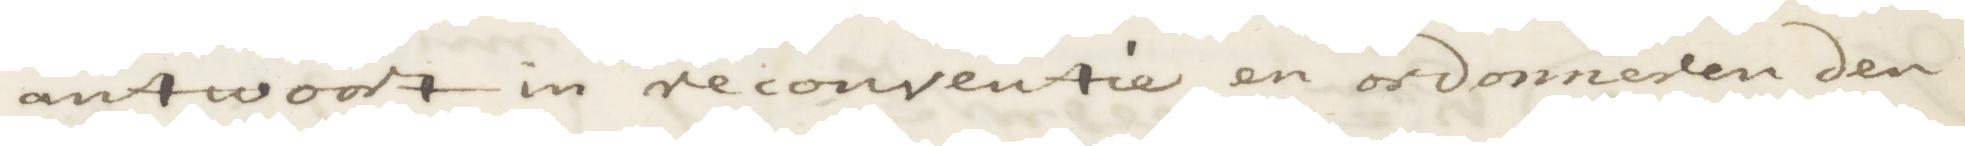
antwoort in reconventie en ordonneren den
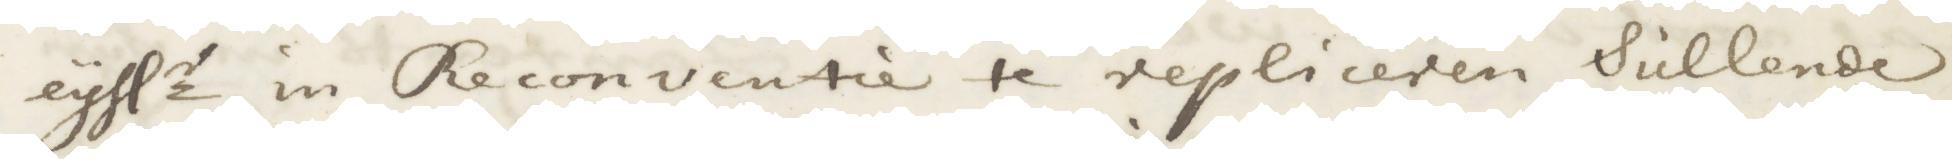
eijss=r in Reconventie te repliceren sullende
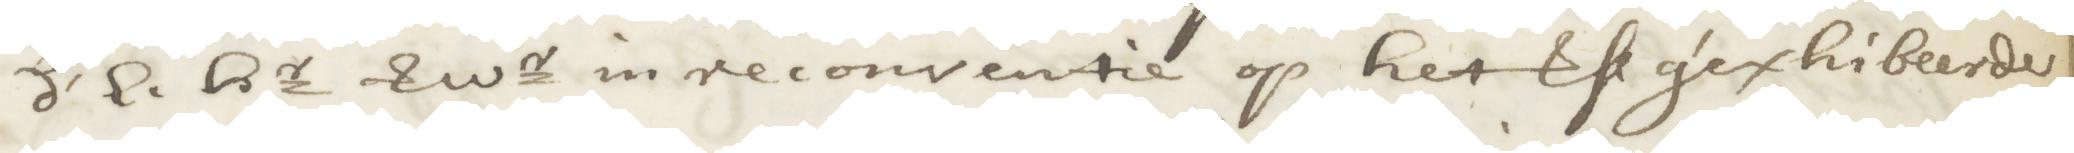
d’ E. h=r verw=r in reconventie op het verse g'exhibeerde
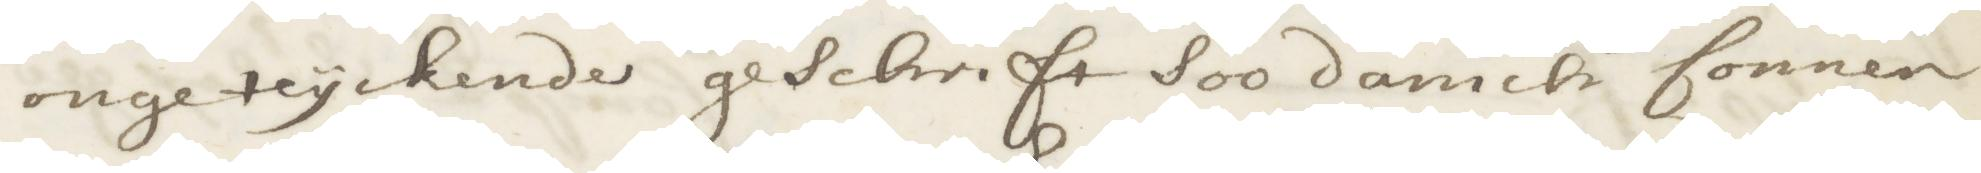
ongeteijckende geschrift soo danich Connen
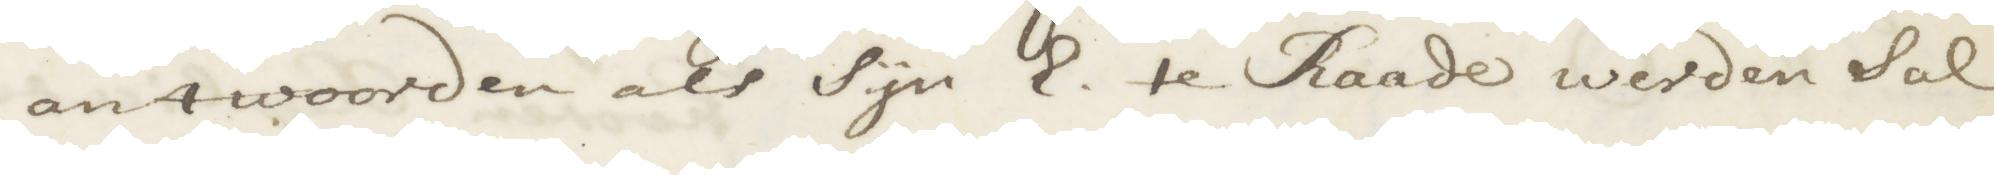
antwoorden als sijn E. te Raade werden sal
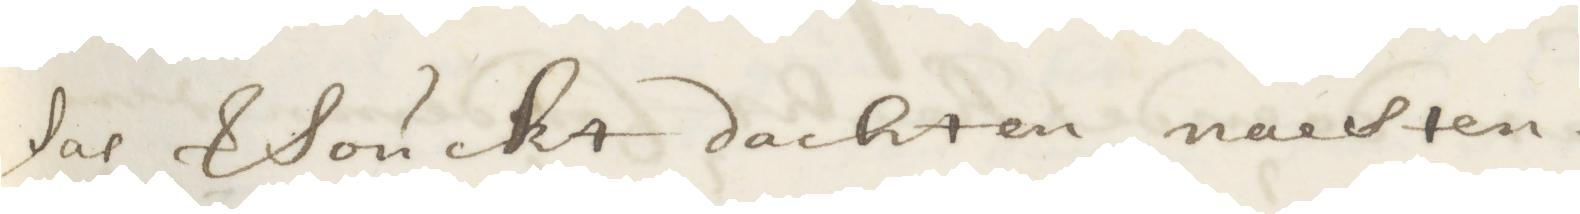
sal versouckt dachten naesten
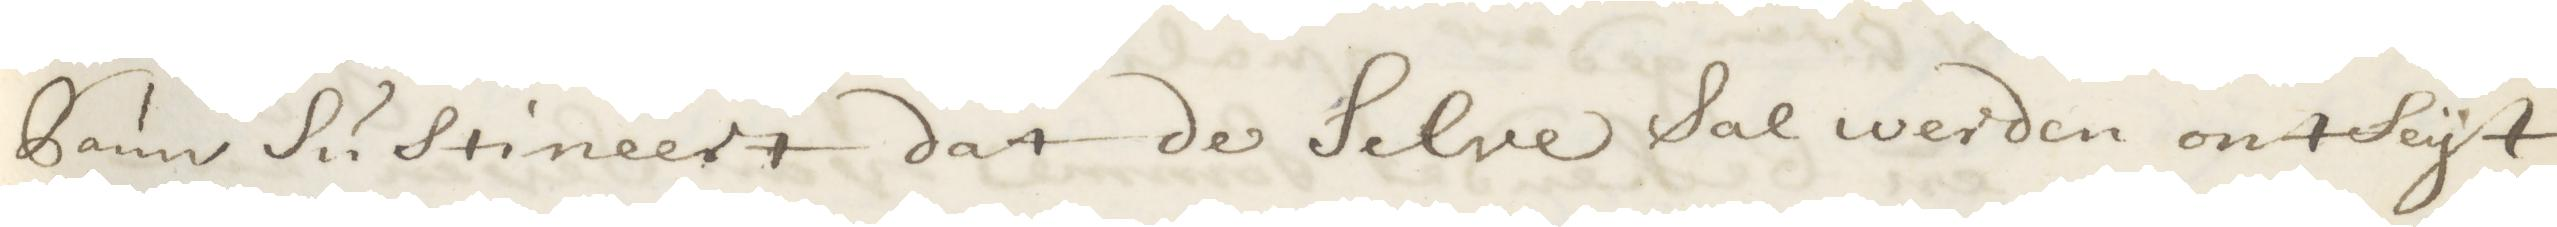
Pauw sustineert dat de selve sal werden ontseijt
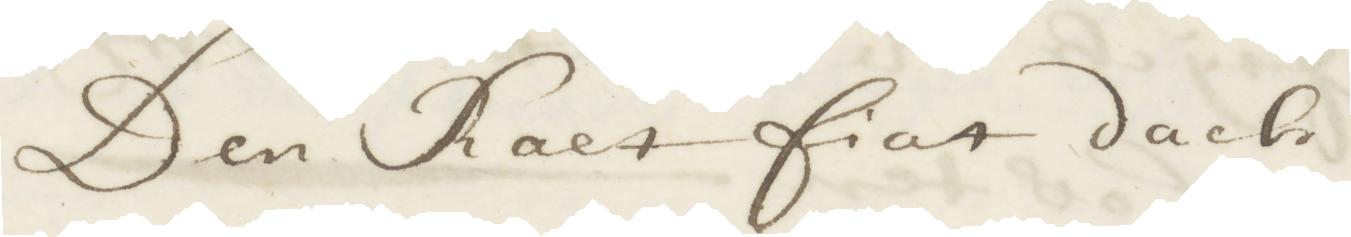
Den Raet fiat dach
